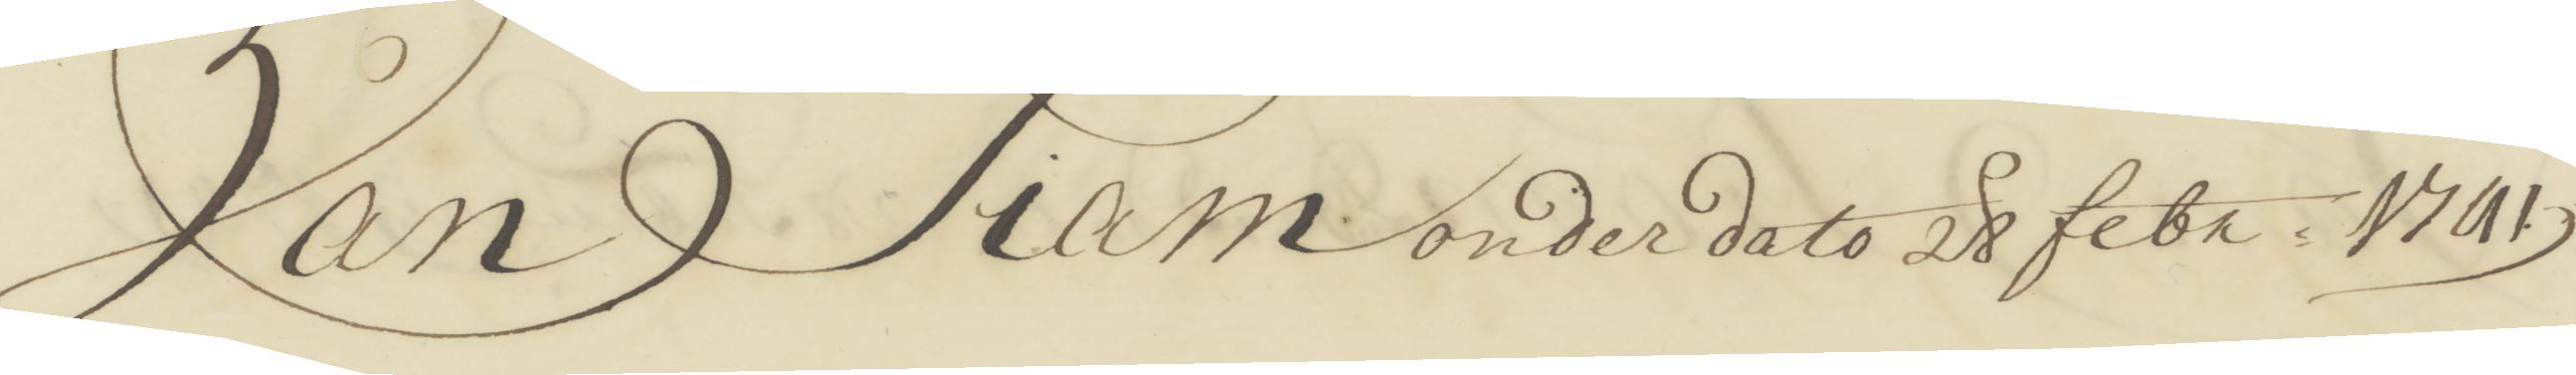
Van Siam onder dato 28 febr: 1741.
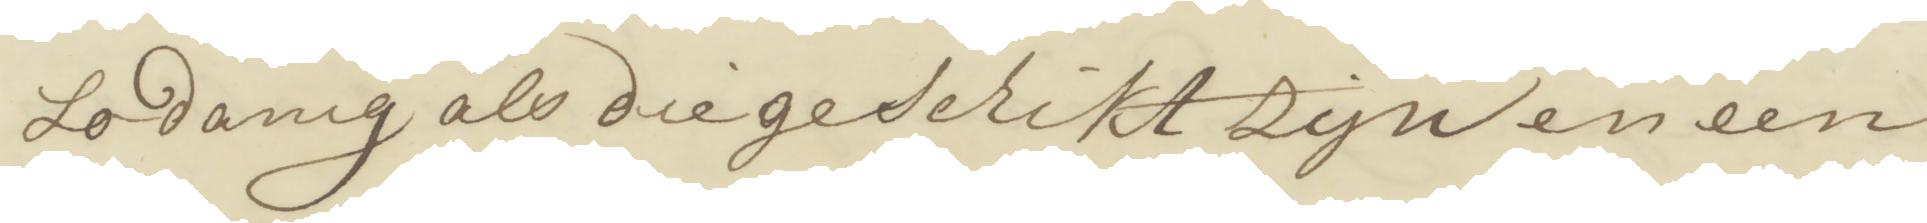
sodanig als die geschikt zijn en een
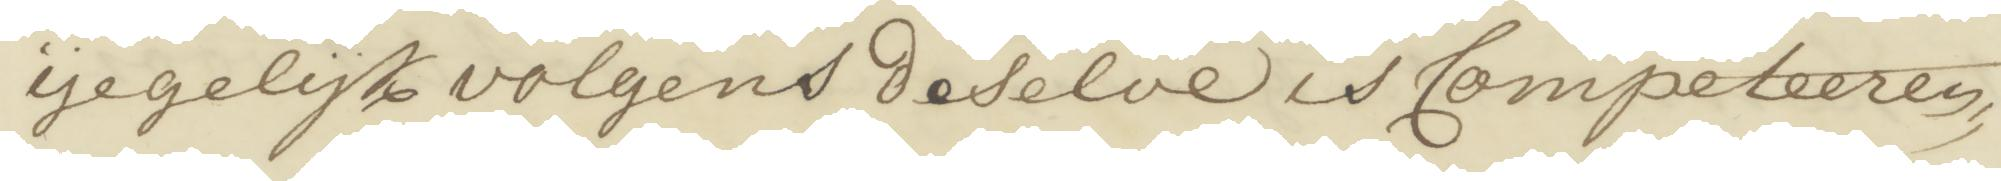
ijegelijk volgens deselve is Competeeren„
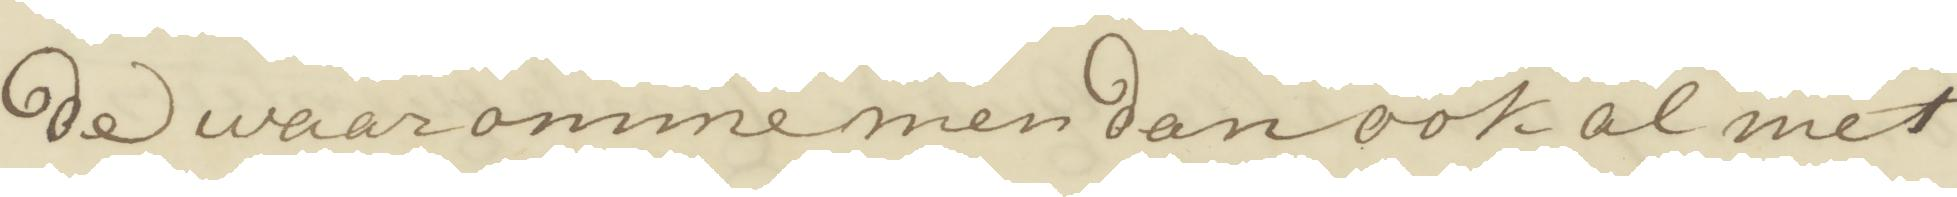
de waaromme men dan ook al met
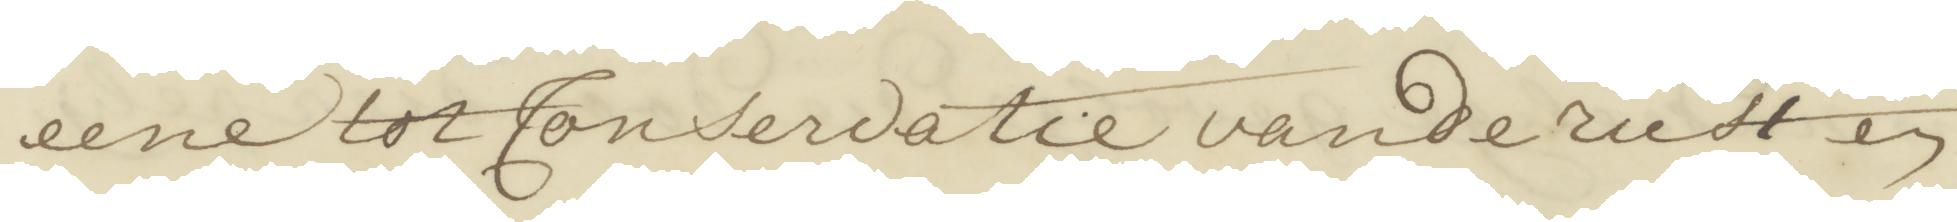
eene tot Conservatie van de rust en
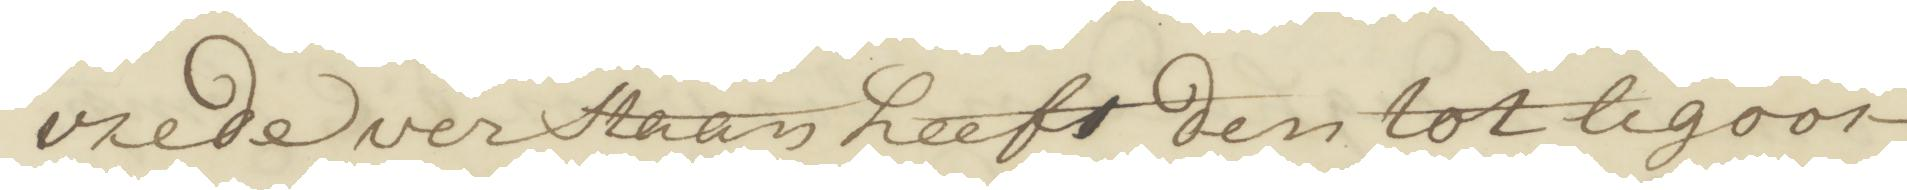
vrede verstaan heeft den tot ligoor
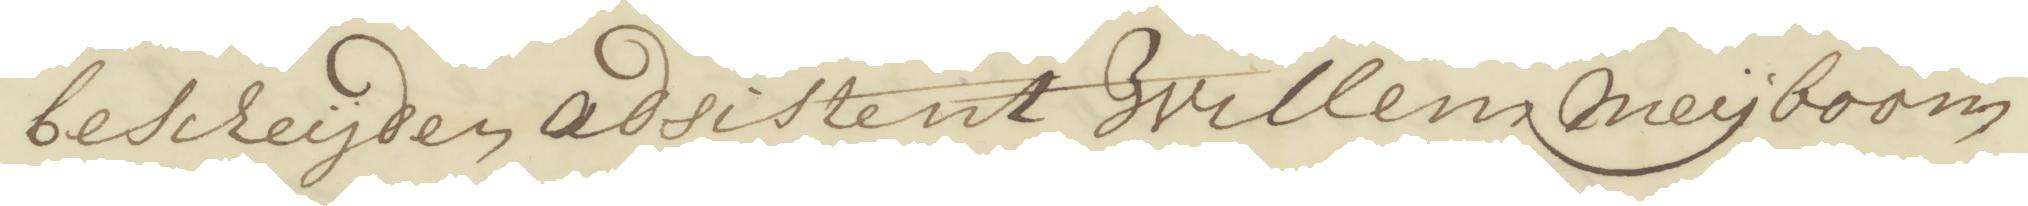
bescheijden adsistent Willem Meijboom
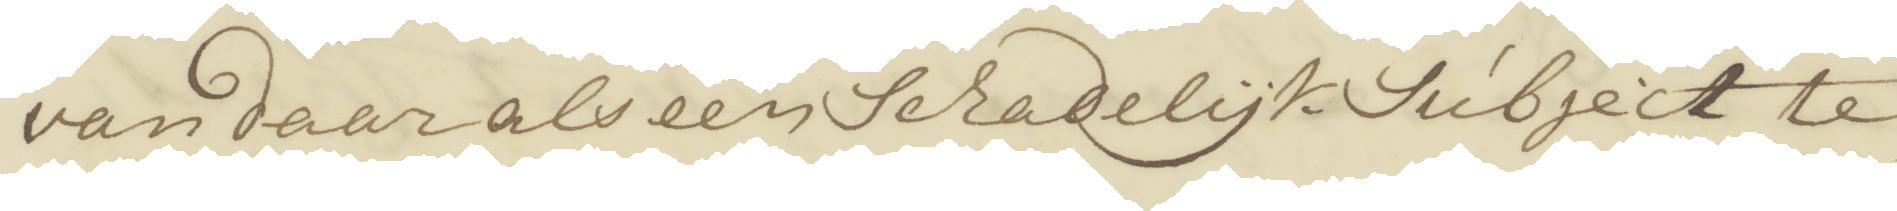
van daar als een schadelijk subject te
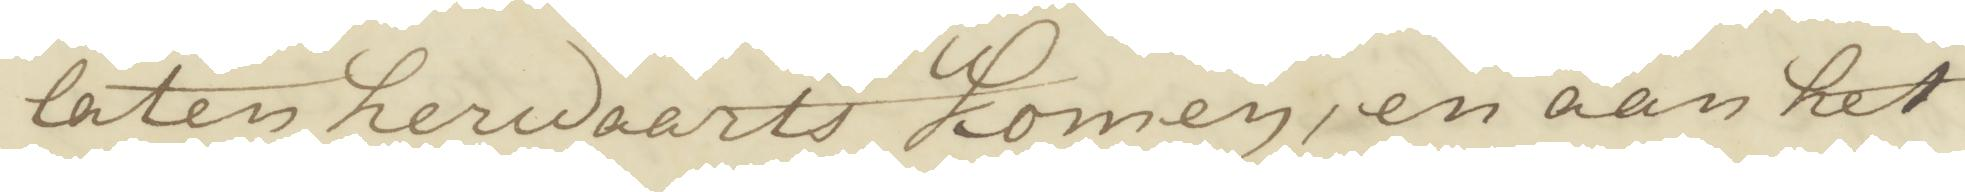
laten herwaarts Komen, en aan het
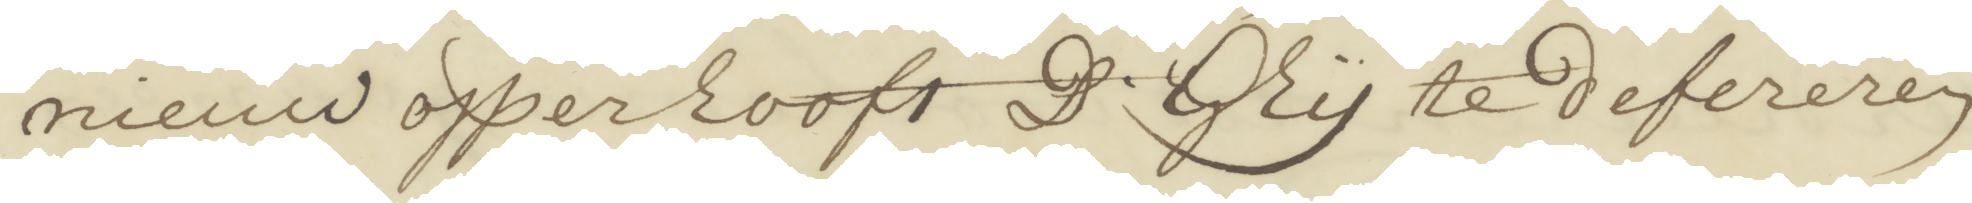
nieuw opperhooft D' Ghij te defereren
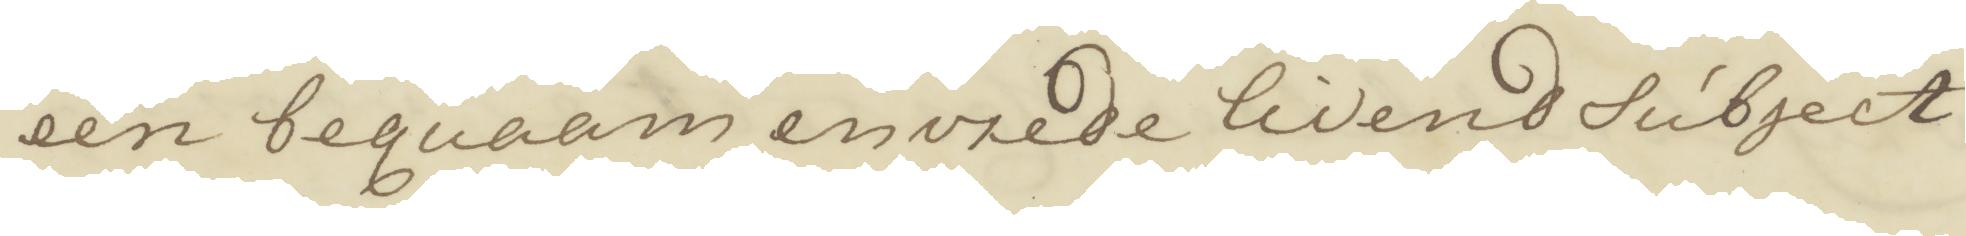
een bequaam en vrede livend subject
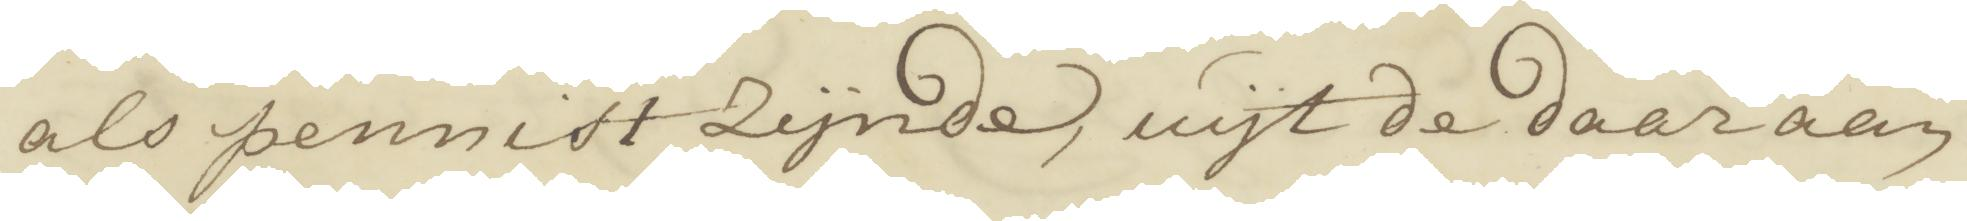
als pennist zijnde, uijt de daar aan
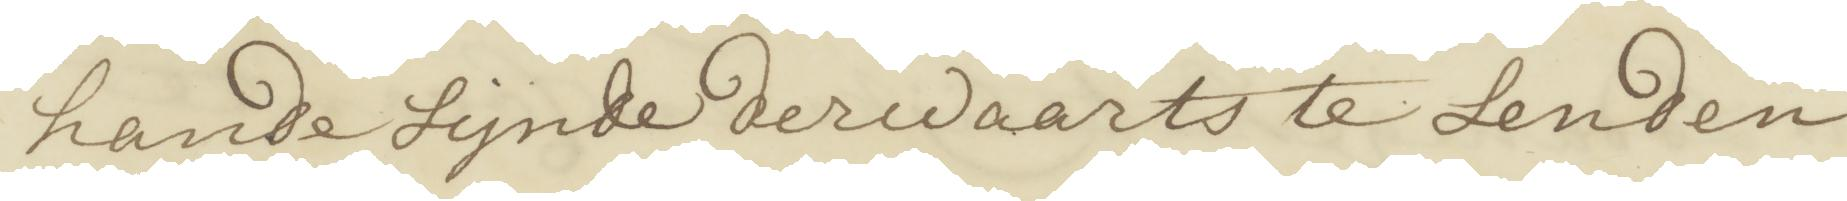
hande sijnde derwaarts te senden
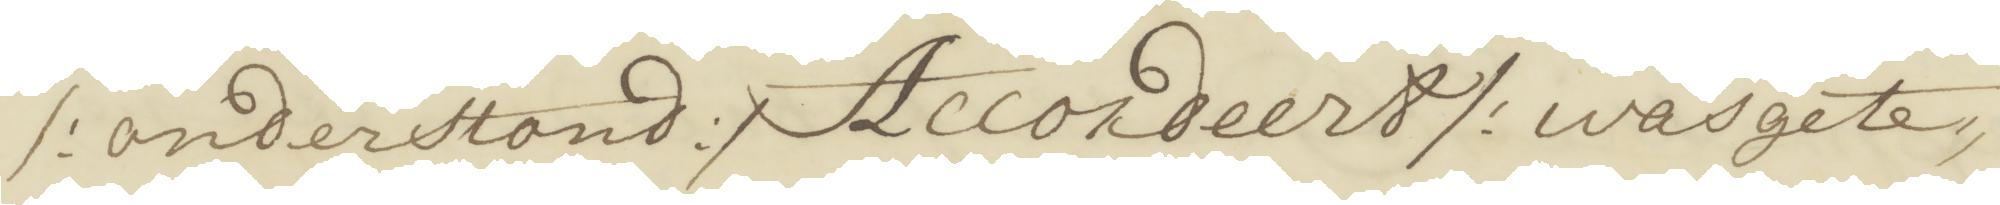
/: onderstond :/ Accordeert /: was gete„
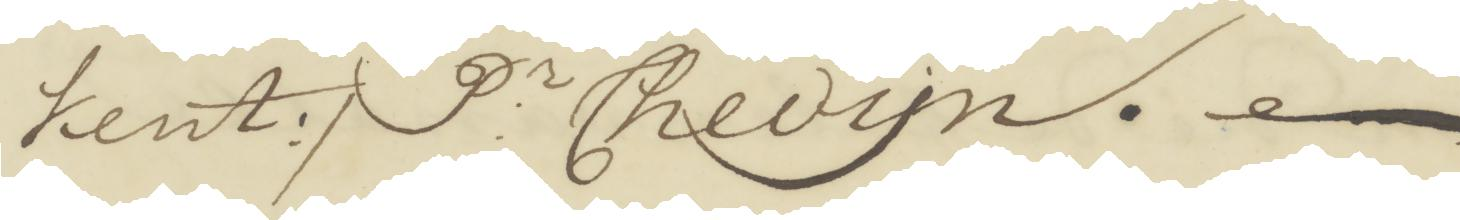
kent :/ P:r Chevijn. en
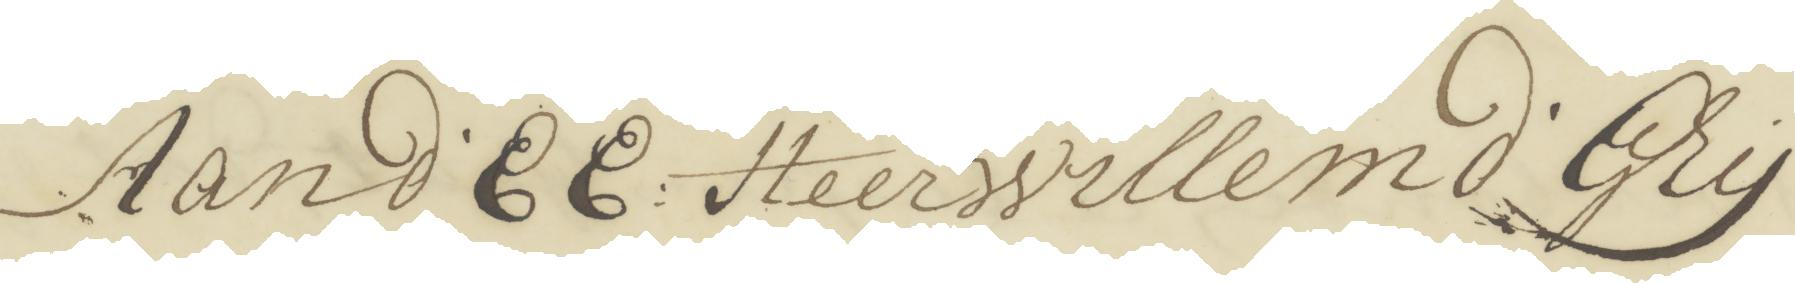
Aan d’ E E: Heer Willem d' Ghij
